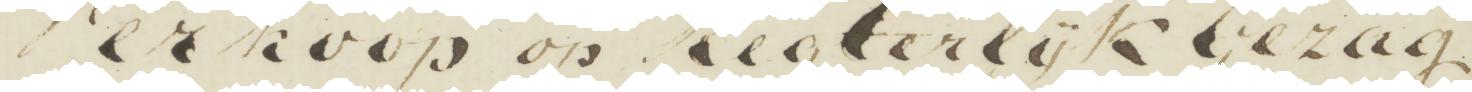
Verkoop op Regterlijk gezag
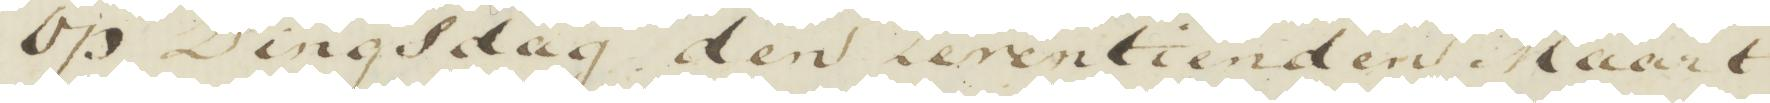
op Dingsdag, den zeventienden Haart
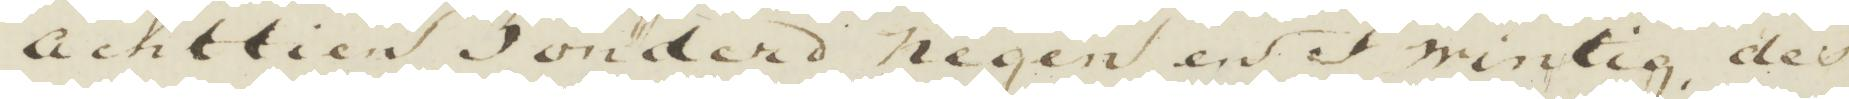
achttien Honderd negen en Twintig, des
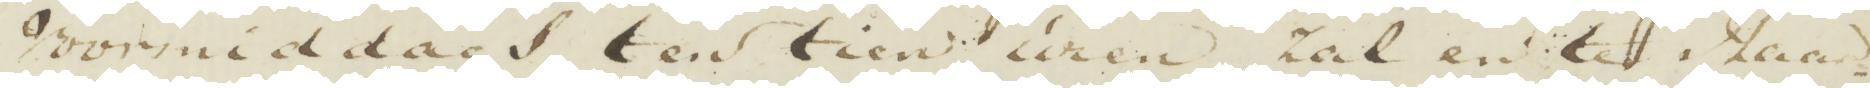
voormiddars ten tien uren zal en te Haar„
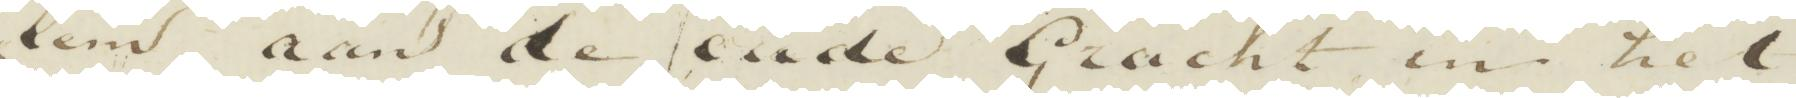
lens aan de soude Gracht, in het
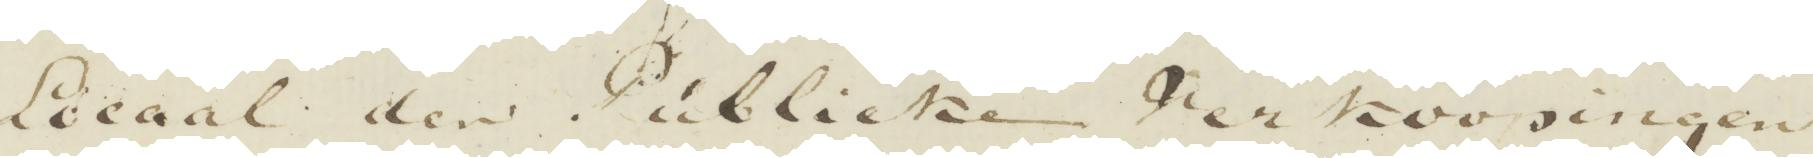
Eicaal den Publieke Verkoopingen
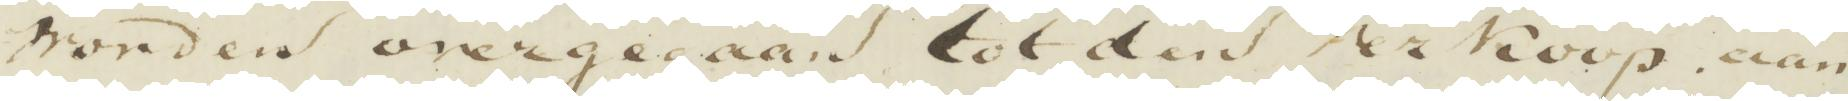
wonden overgevaan tot den verkoop, aan
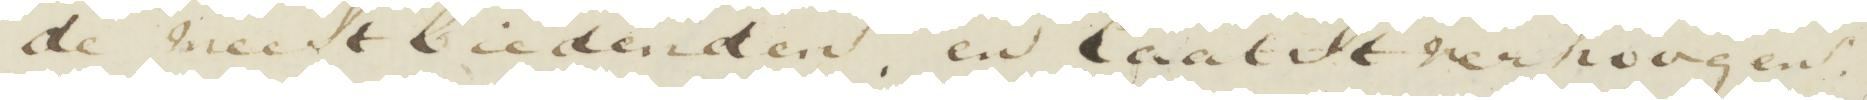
de meest biedenden, en laatst verhoogen.
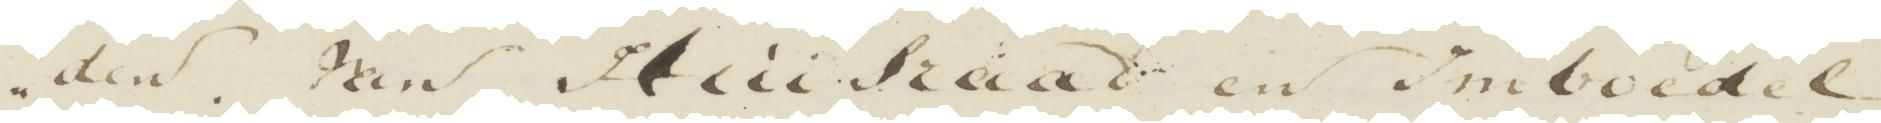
„den van Huisraad en Imboedel
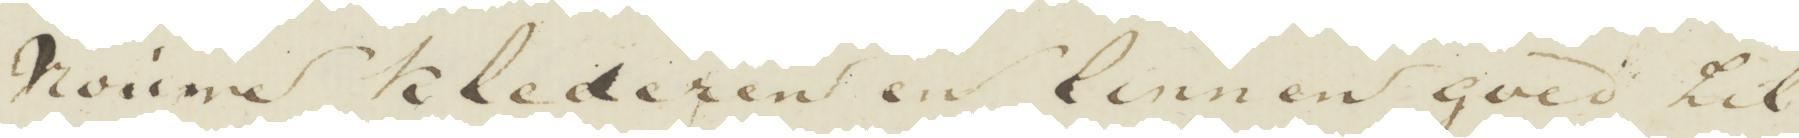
Vrouwe klederen en binnen Goed Zil
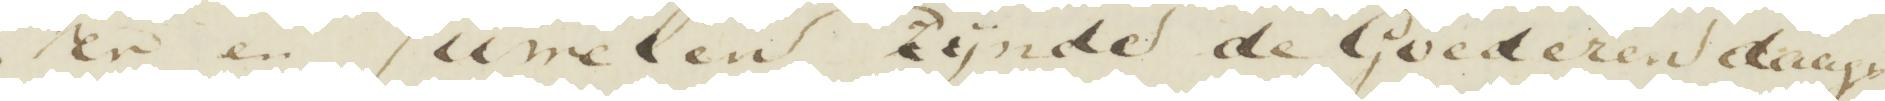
ven en Juwelen zijnde de Goederen daar
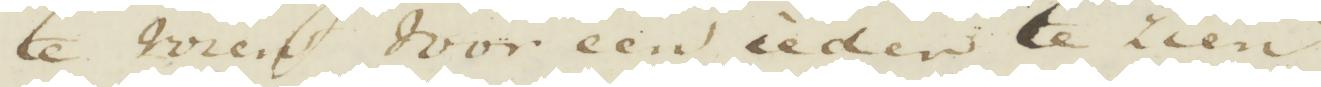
te viren voor een ieden te zien
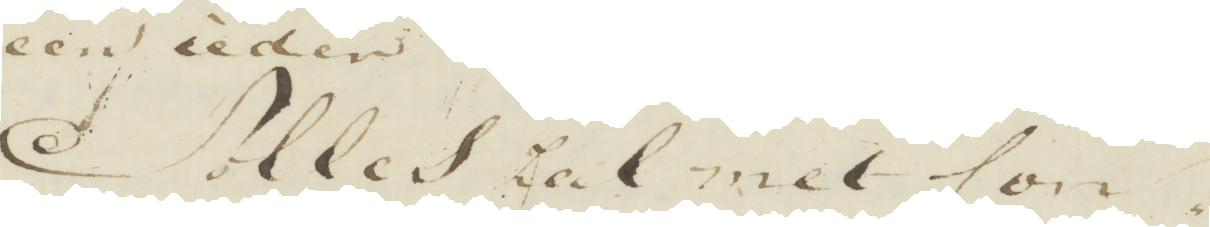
J Alles zal met son„
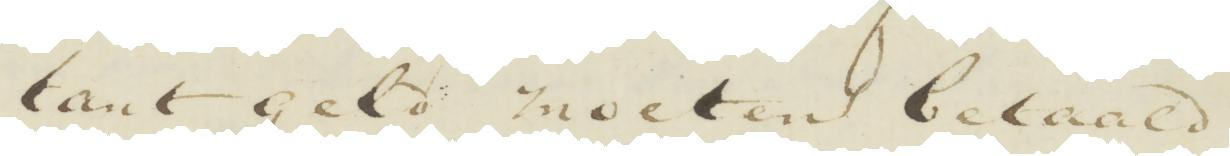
lant geld moeten betaald
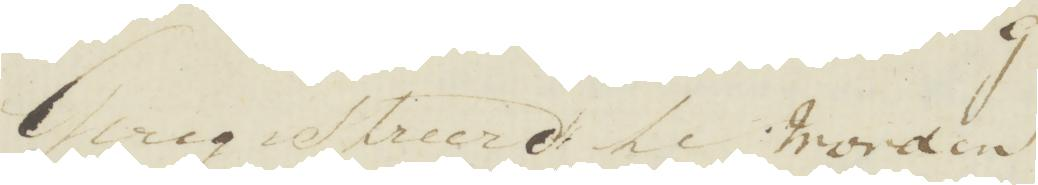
Geregistreerd te worden
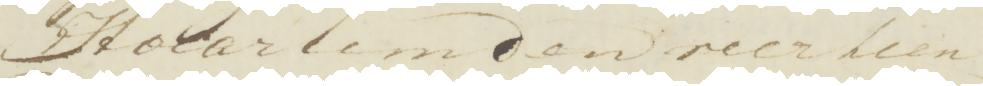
Hoarlem den veertien
